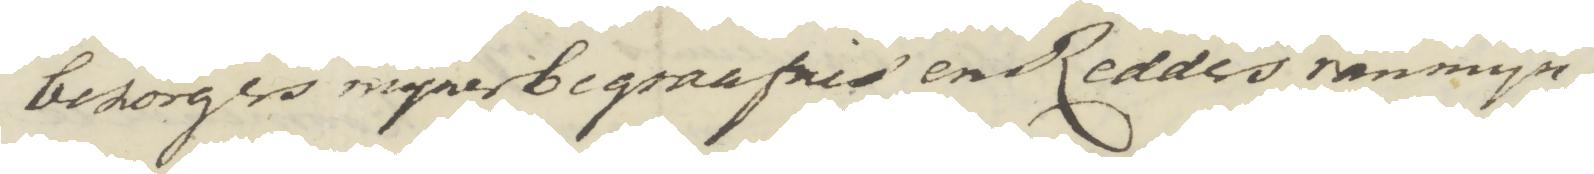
bezorgers mynerbegraafenis en Redders van myn
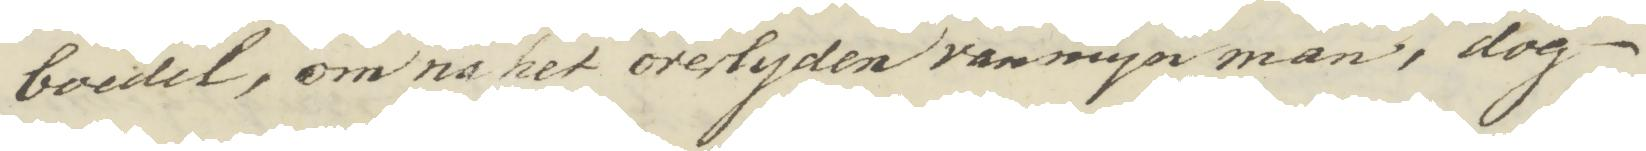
boedel, om na het overlyden vanmyn man, dog
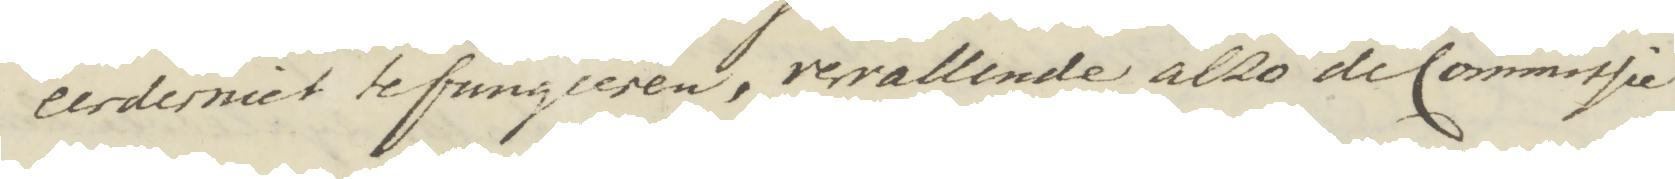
eerderniet te fungeeren, vervallende alzo de Commissie
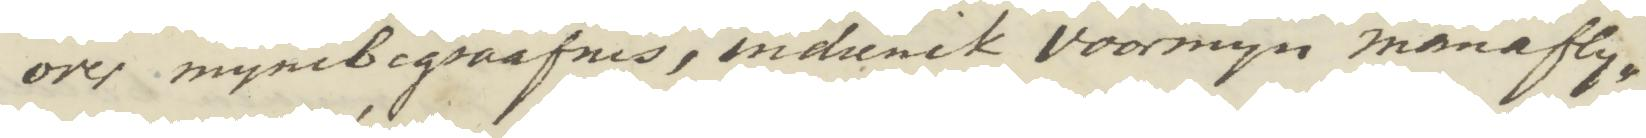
over myne begraafnis, indienik voormijn manaflij„
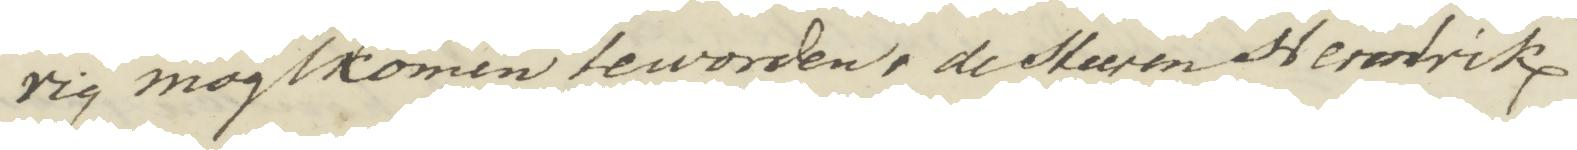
vig mogtkomen teworden, de Heeren Hendrik
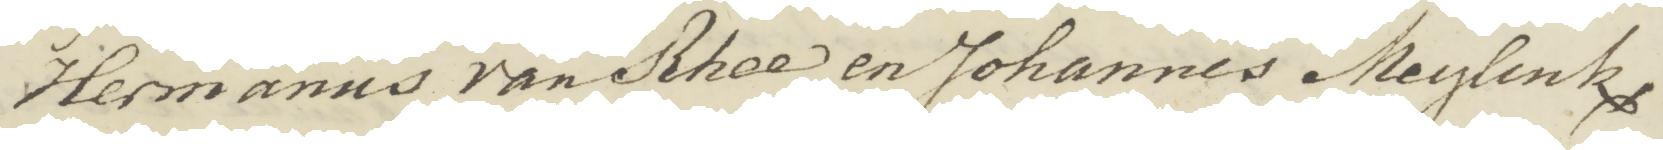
Hermanus van Rhee en Johannes Meylink,
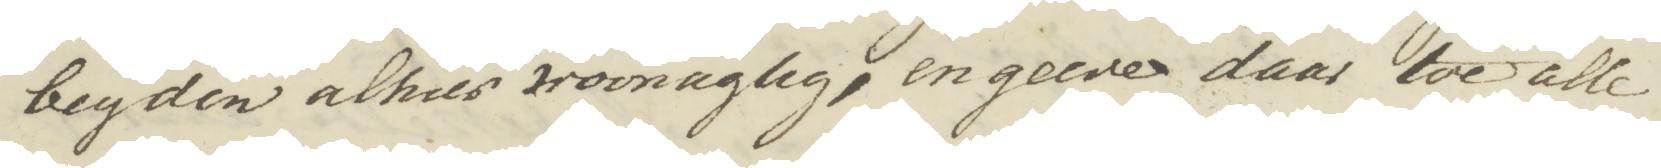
beyden alhier woonagtig, en geeve daar toe alle
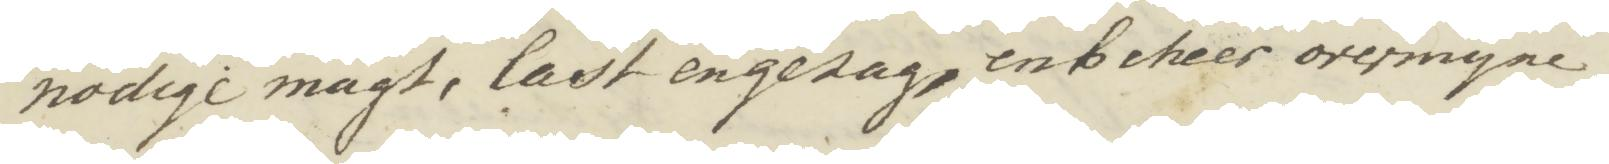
nodige magt, last en gezag, enbeheer overmijne
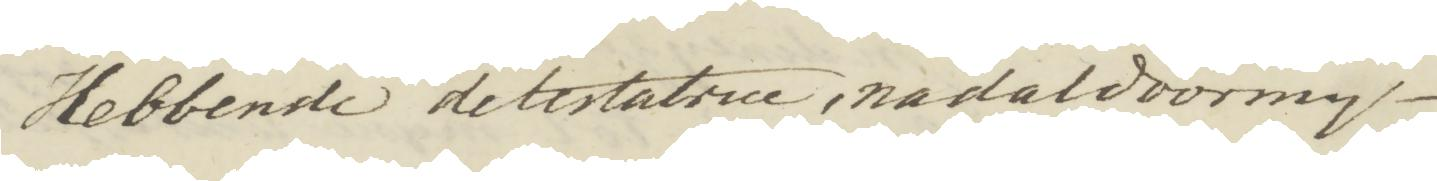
Hebbende detestatrice, nadatdoormy -
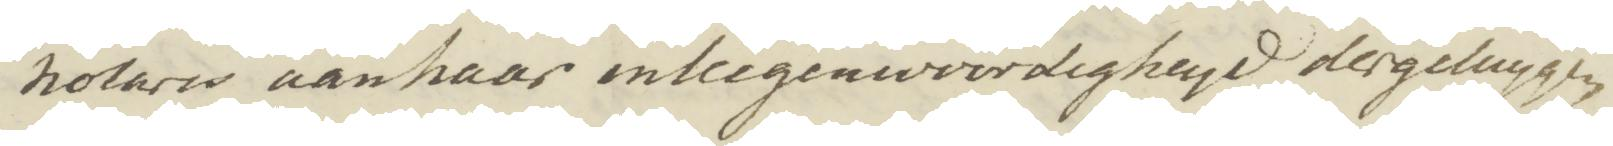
notaris aan haar inteegenwoordigheijd dergetuygen
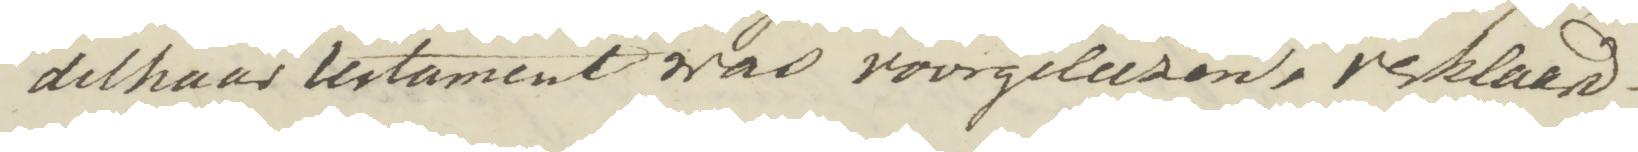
dit haar testament was voorgeleezen, verklaard
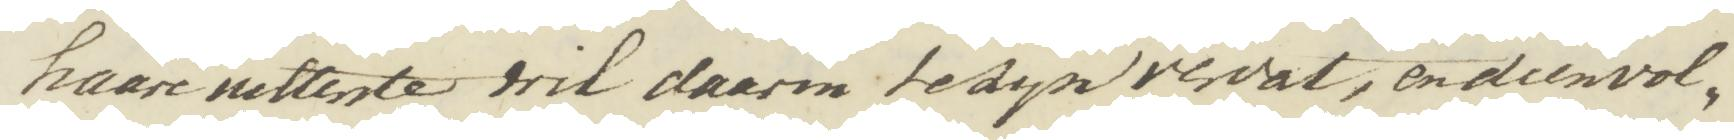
haare uitterste wil daarin te zijn vervat, en dienvol„
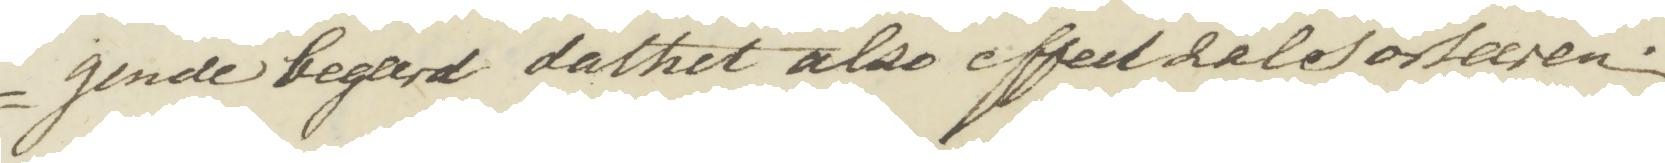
=gende begeerd, dathet alzo effect zalsorteeren.
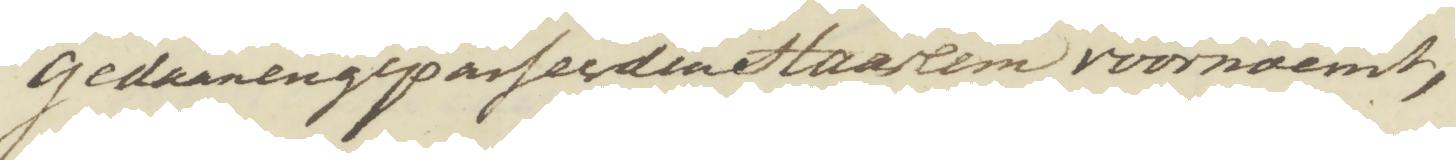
GedaanengepasseerdinHaarlem voornoemt,
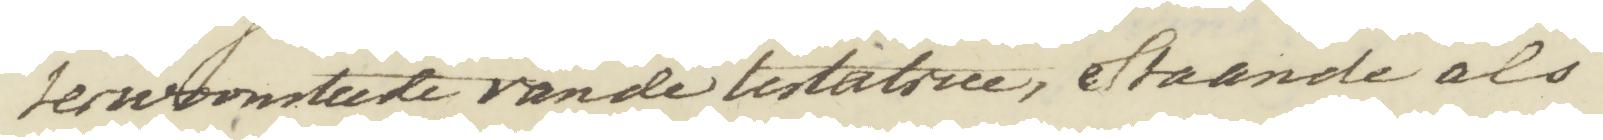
terwoonsteede vande testatrice, staande als
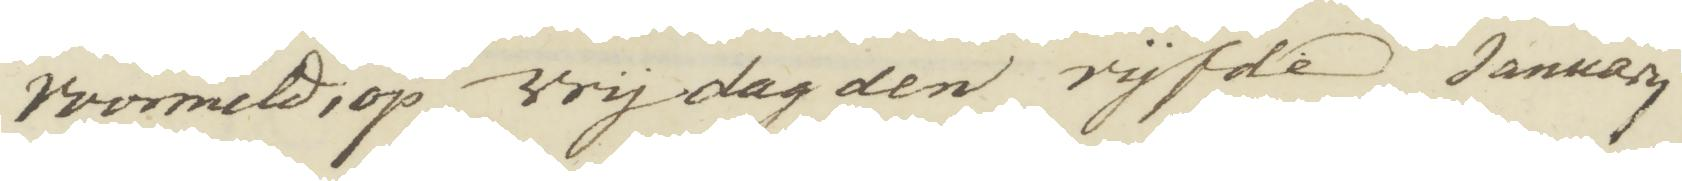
voormeld, op vrij dag den vijfde Ianuary
